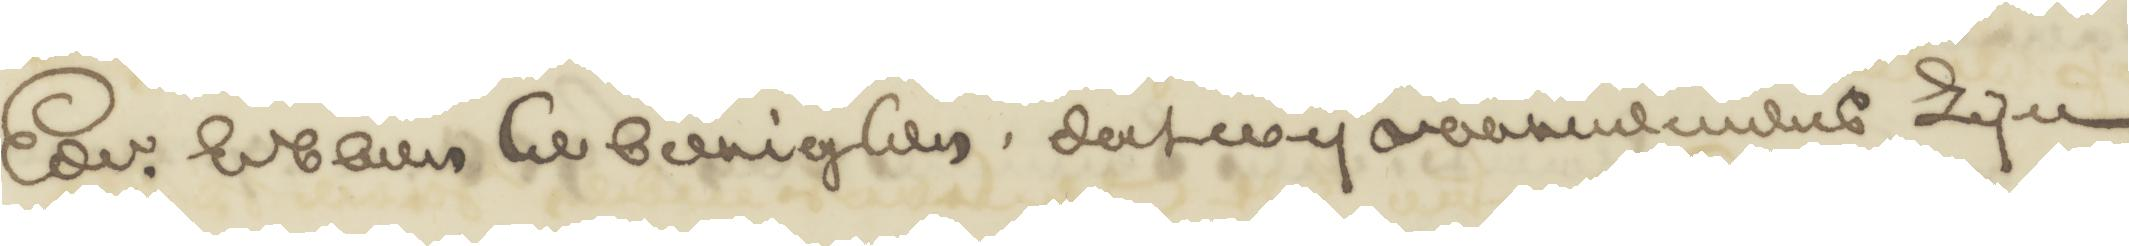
Ede. hebben te berigten, dat wij voornemens zijn
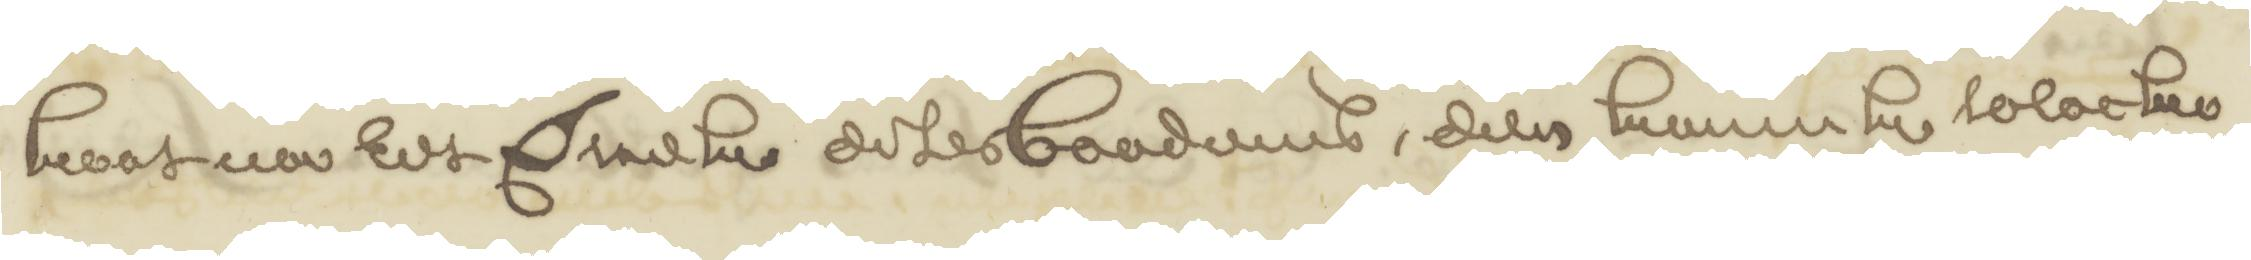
kort na het vertrek deses boodems, den konink tolacko
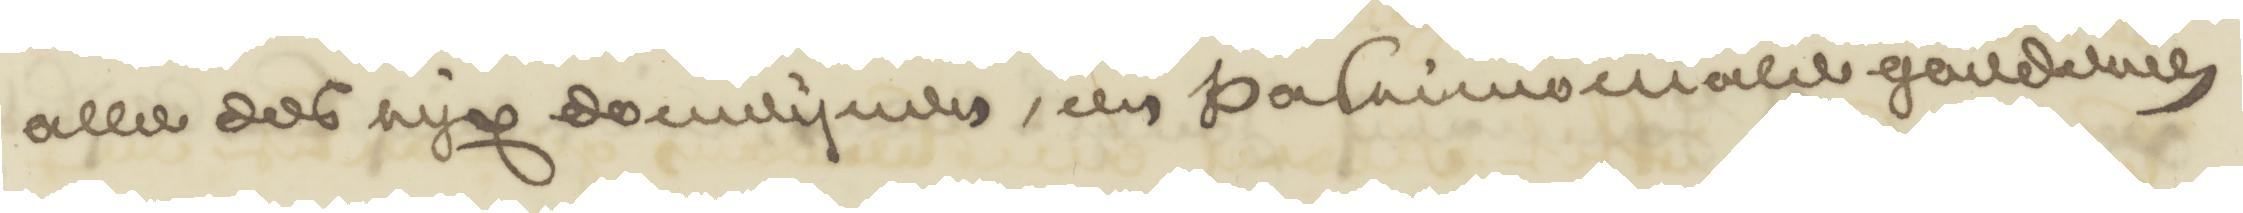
alle des rijx domeijnen, een patrimoniale goederen
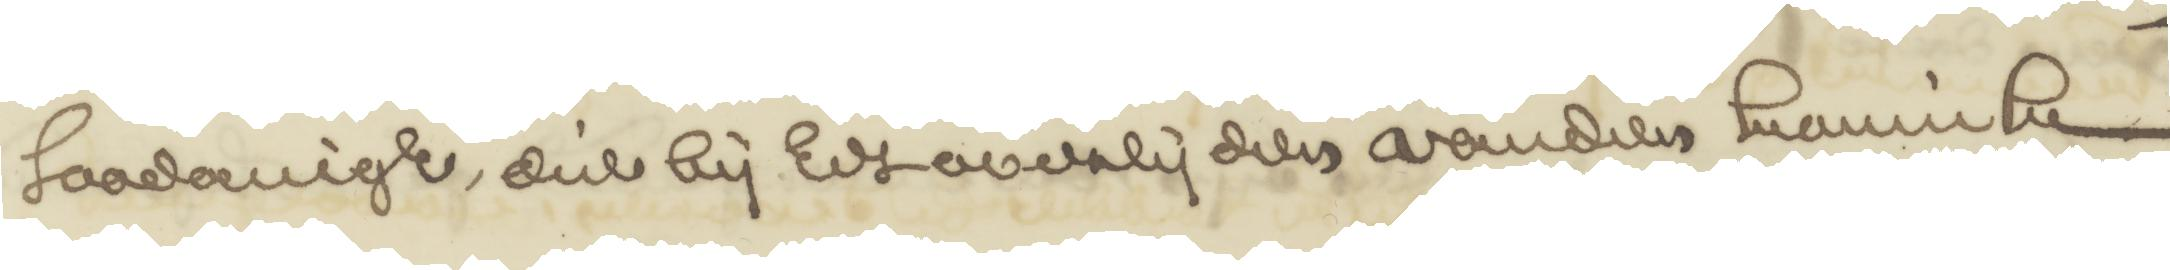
soodanigh, die bij het overlijden vanden konink
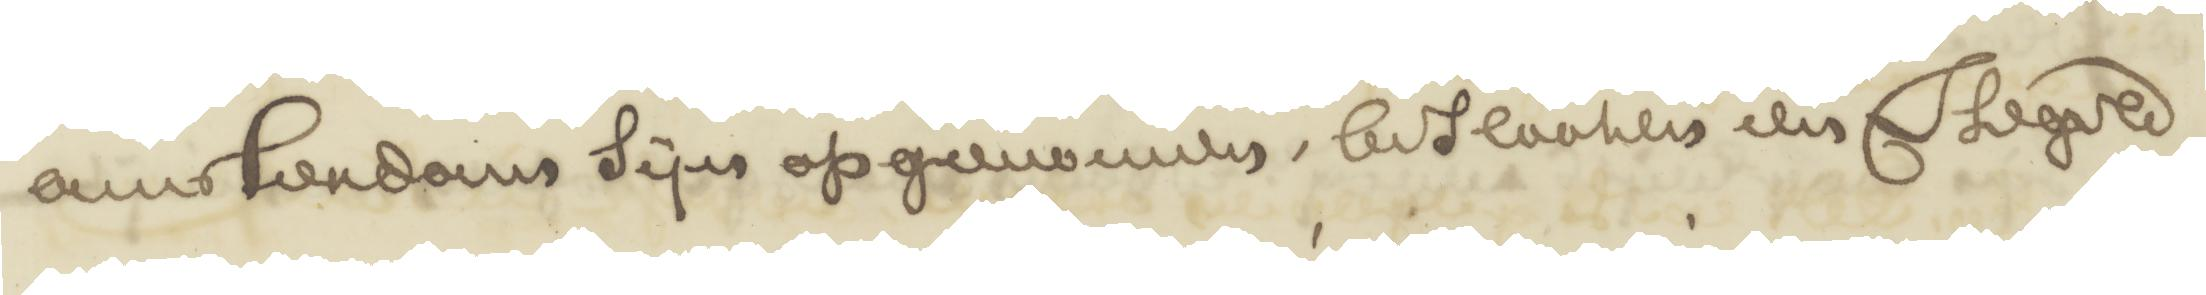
amsterdam sijn op genomen, beslooten en versegeld
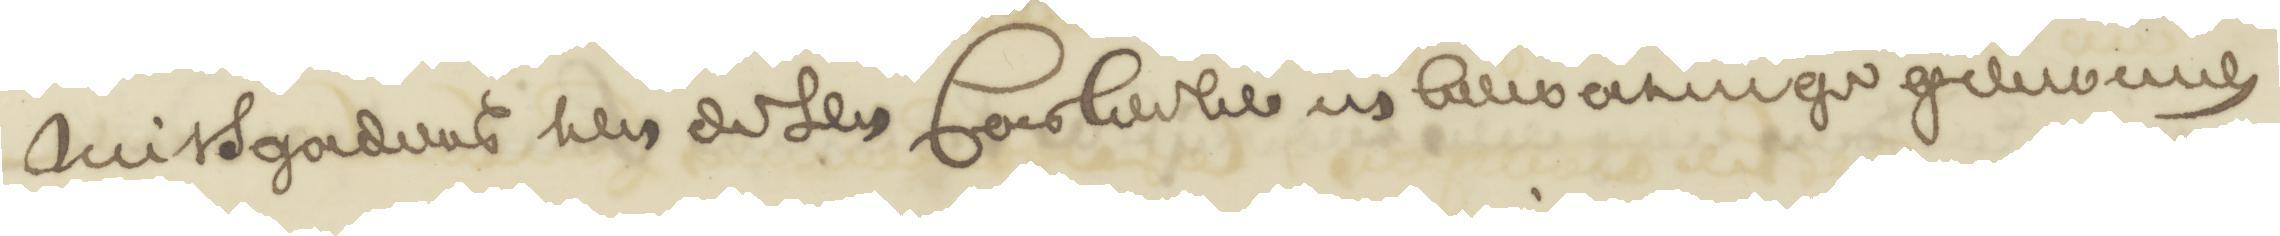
mitsgaders ten desen Casteele in bewaringe genomen
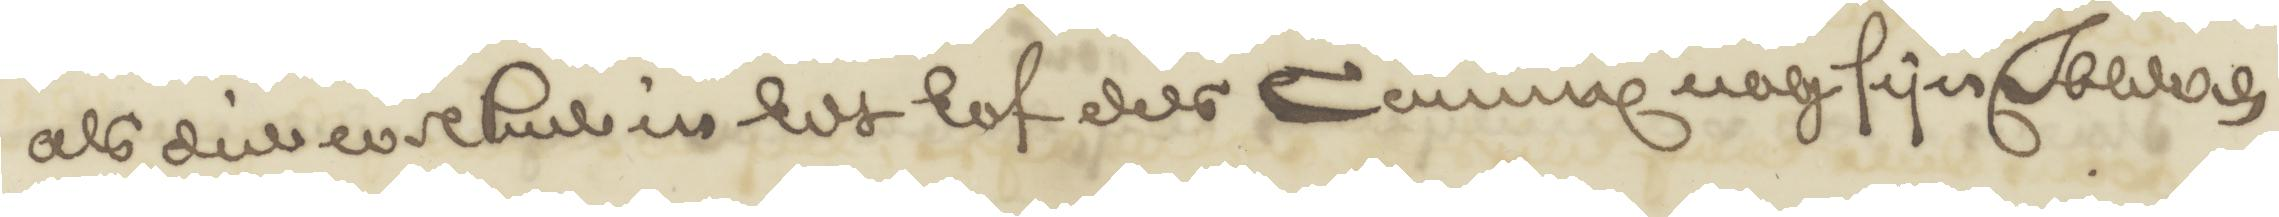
als die welke in het hof des Coninx nog sijn verbleven
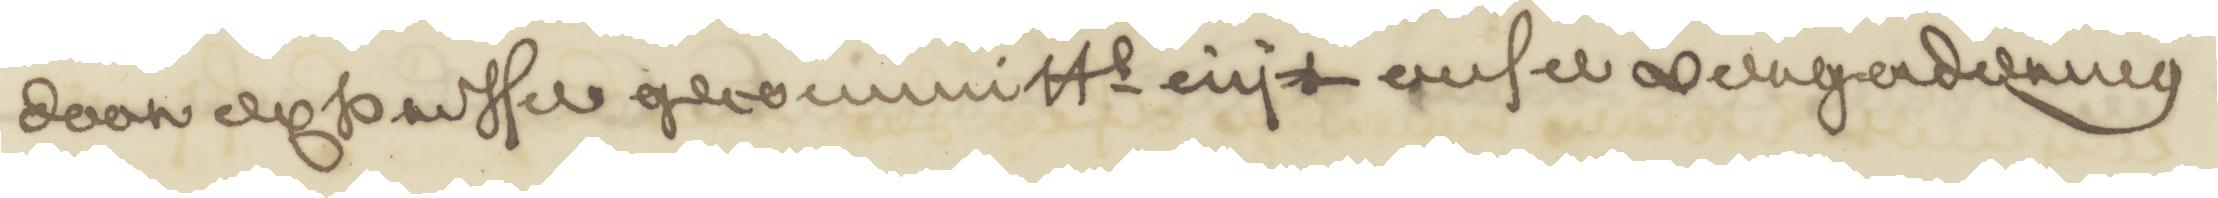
door expresse gecommitt=s uijt onse vergadering
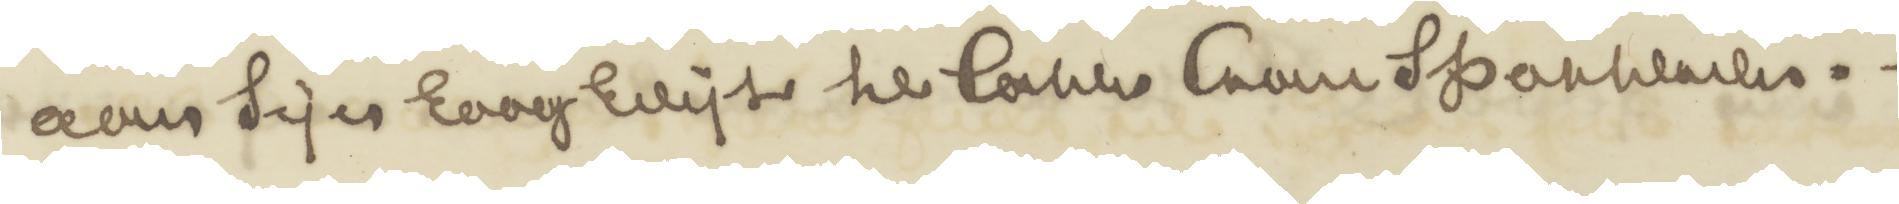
aan sijn hoog heijt te laten transporteren.
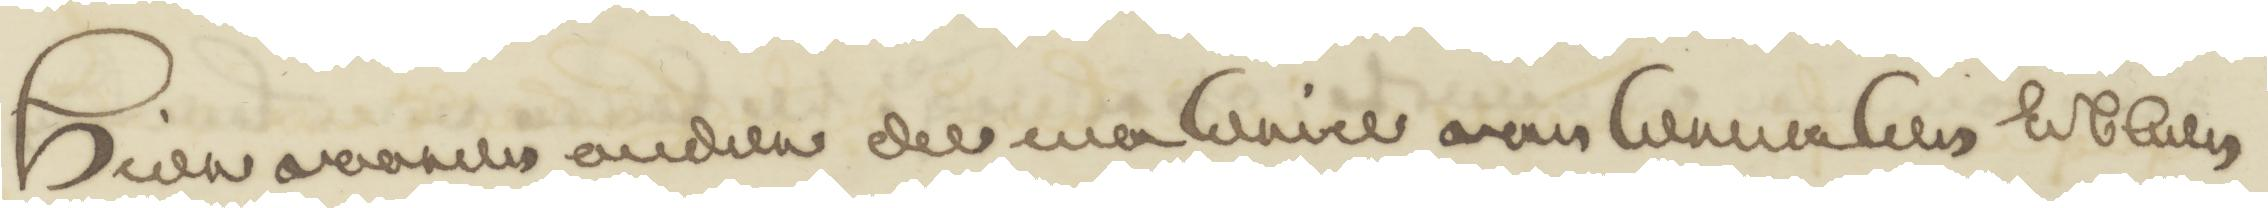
Hier vaaren onder de materie aan ternaten hebben
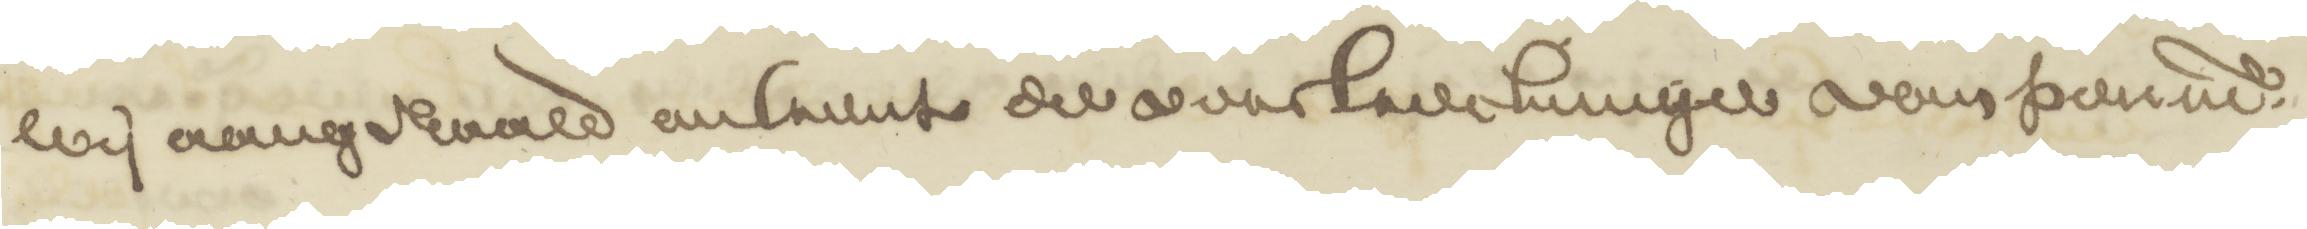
wij aangehaald omtrent de verstreckinge van panne:
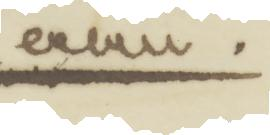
erven.
